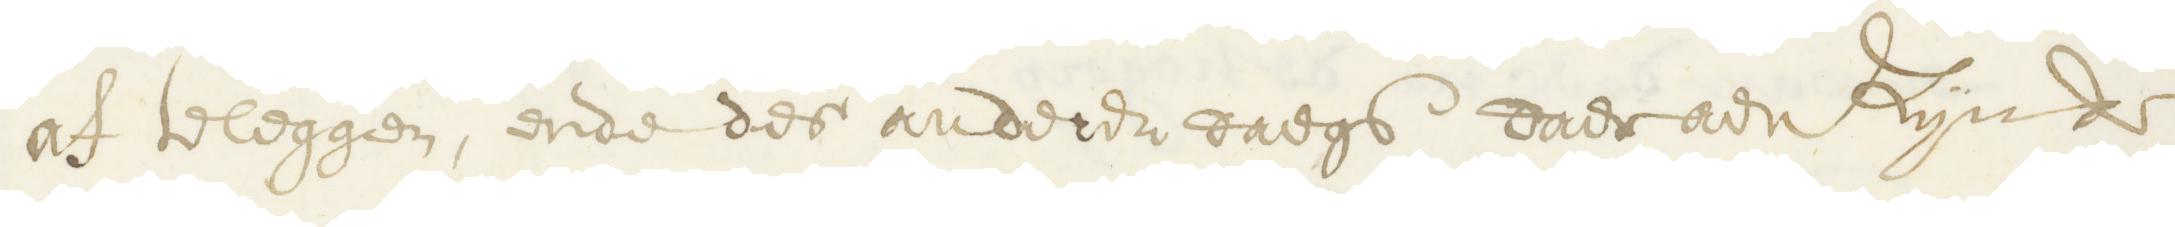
af teleggen, ende des anderen daegs daer aen zijn de
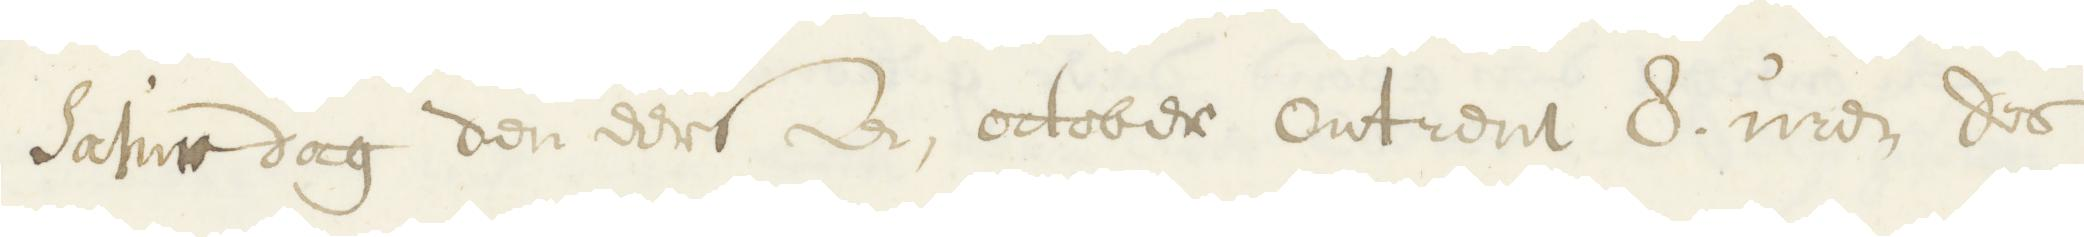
saturdag den eersten, october ontrent 8. uren des
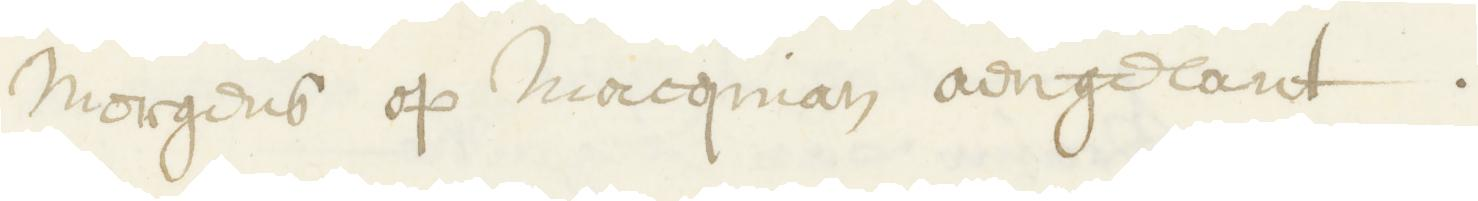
morgens op macquian aengelant.
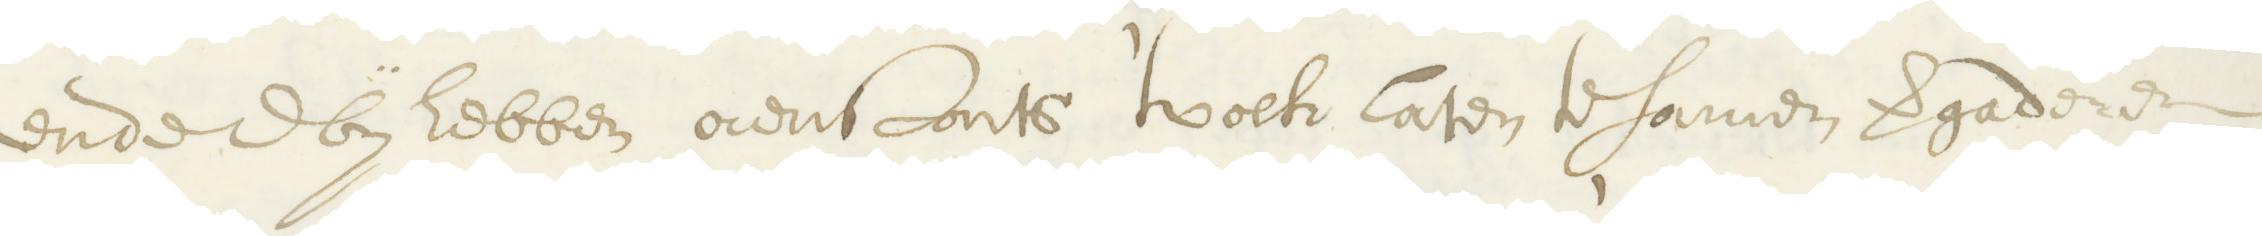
ende wij hebben aenstonts 'tvolk laten tesamen vergaderen
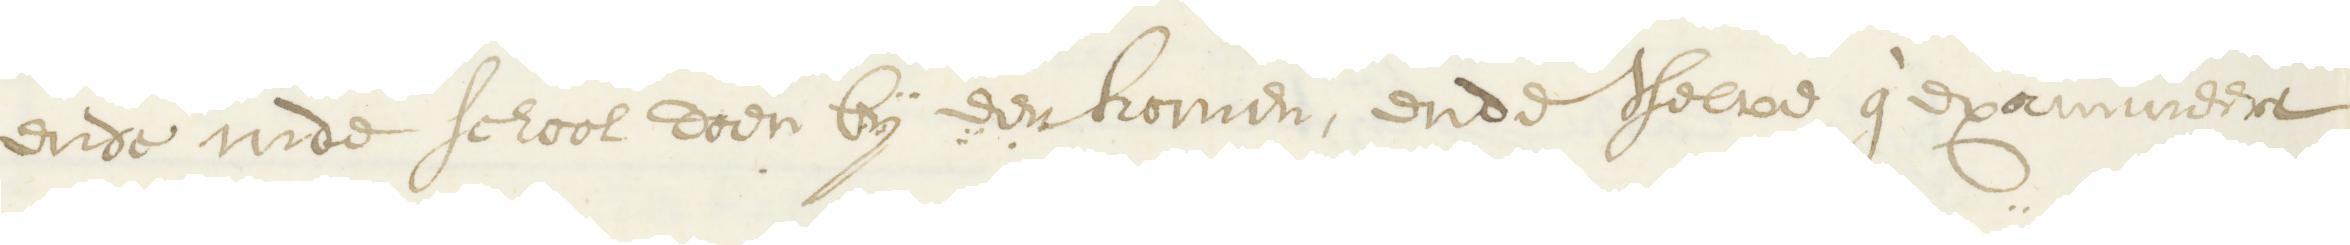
ende inde school doen bij een komen, ende 'tselve g’examineert
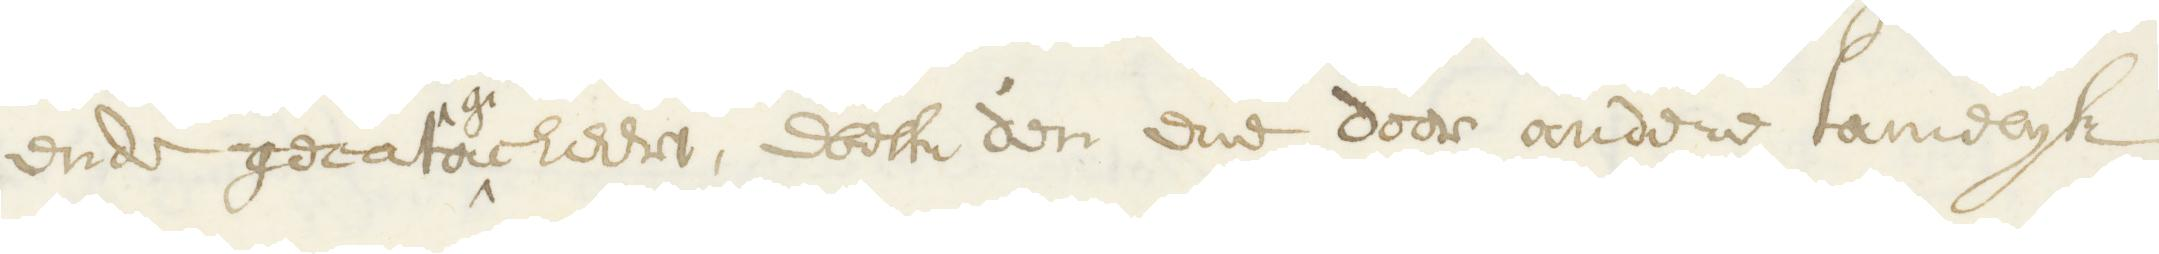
ende gecat^gia^cheert, welk den ene door andere tamelijk
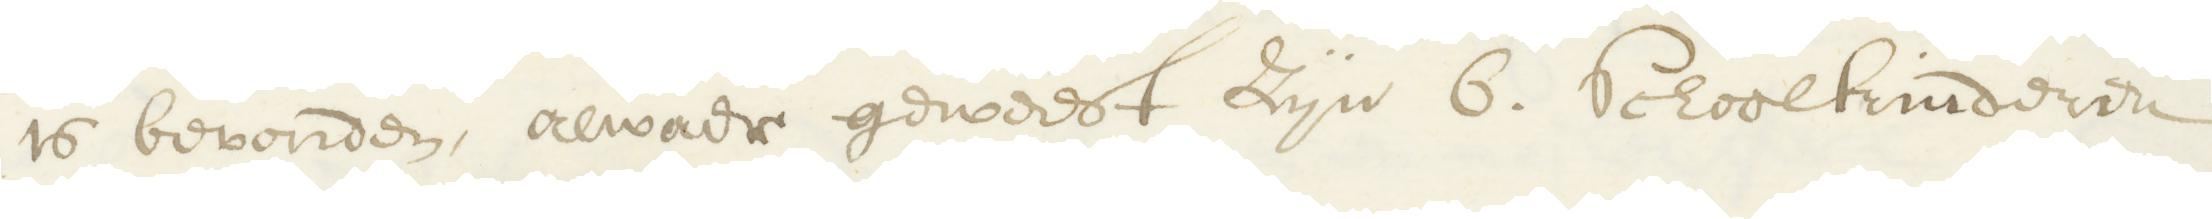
is bevonden, alwaer geweest zijn 6. schoolkinderen
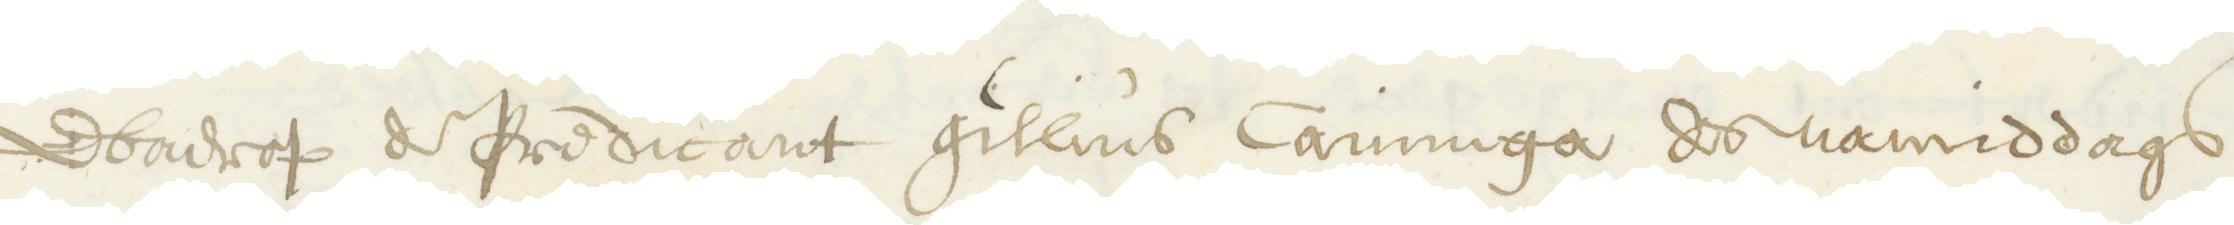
waerop de predicant gillius Caminga des namiddags
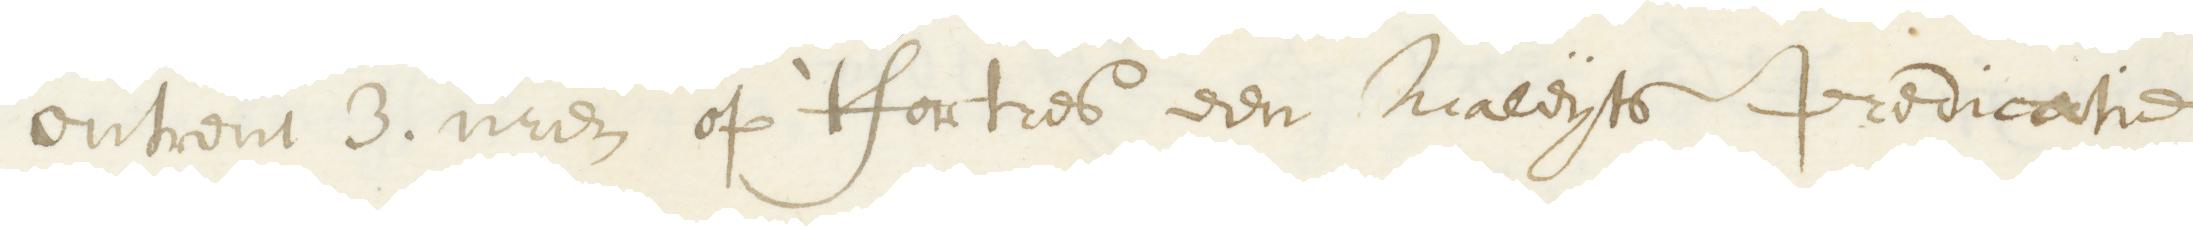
ontrent 3. uren op 't fortres een maleijts predicatie
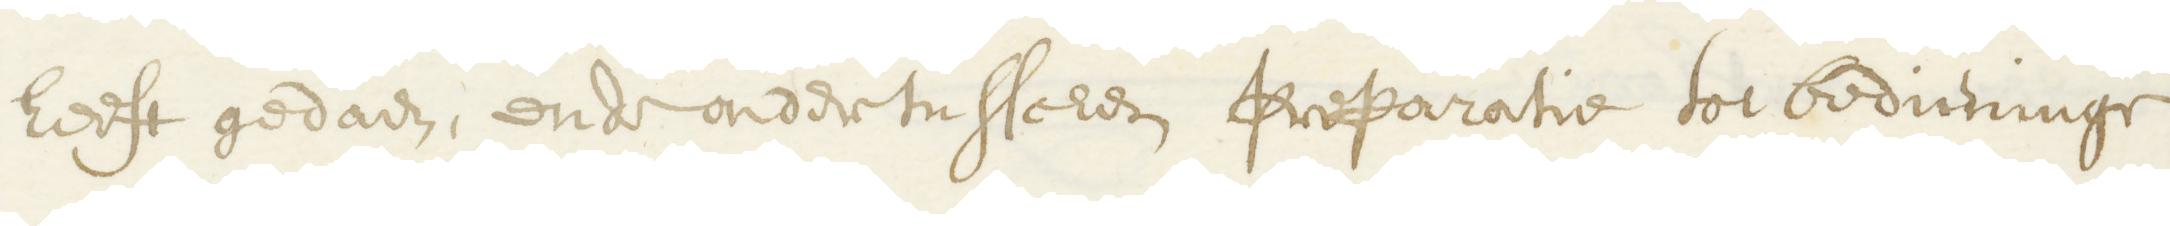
heeft gedaen, ende ondertusschen preparatie tot bedieninge
